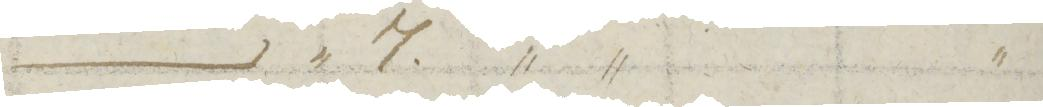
— „ 7. „ „ „
